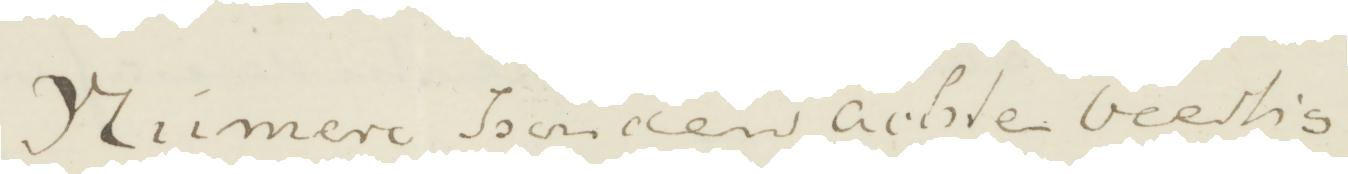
Numero Honderd achten veertig
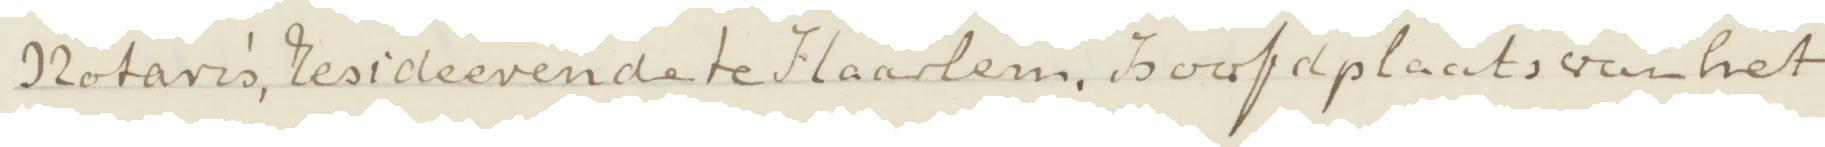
Notaris, resideerende te Haarlem, hoofdplaats van het
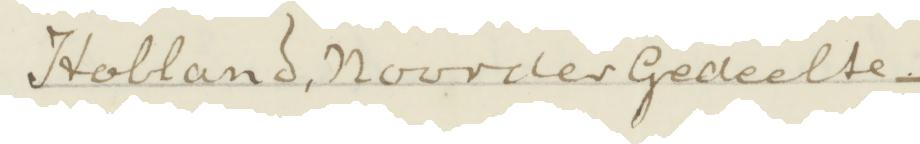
Holland, Noorder Gedeelte
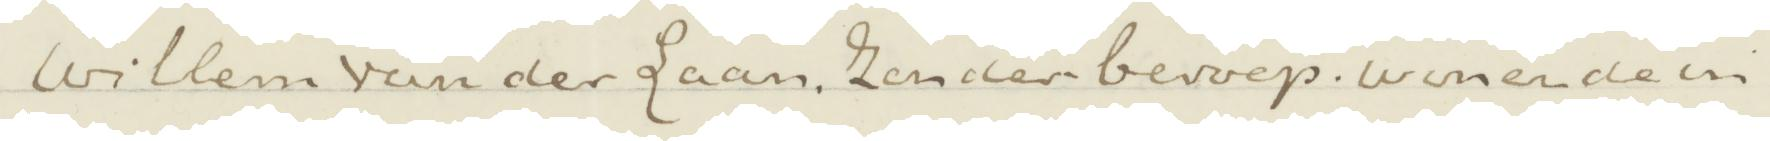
Willem van der Laan. Zonder beroep. wonende in
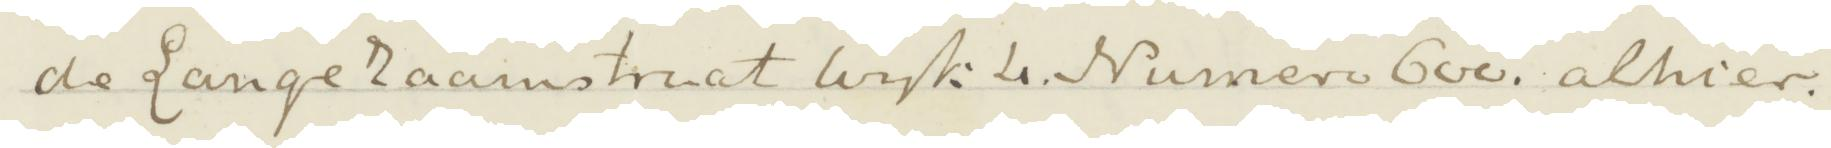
de Lange Raamstraat wijk 4. Numero 600. alhier.
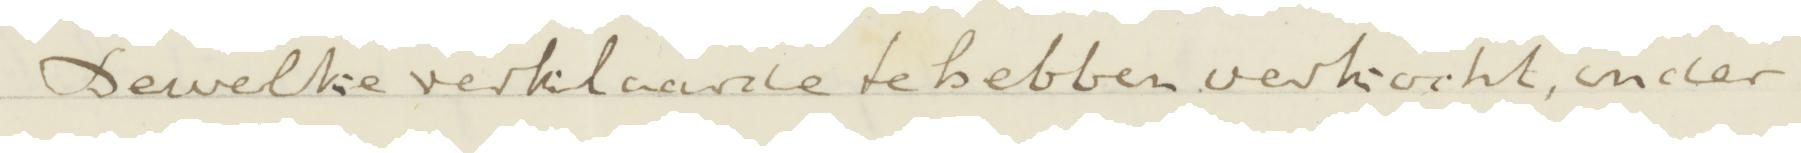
Dewelke verklaarde te hebben verkocht, in der
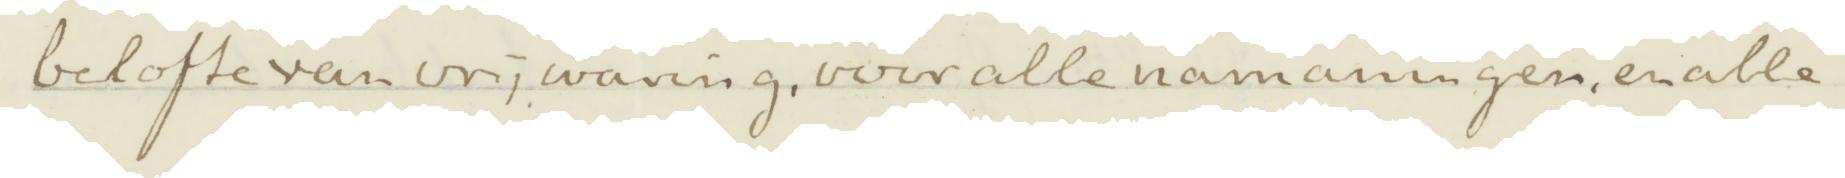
belofte van ontwaring, voor alle namaningen, en alle
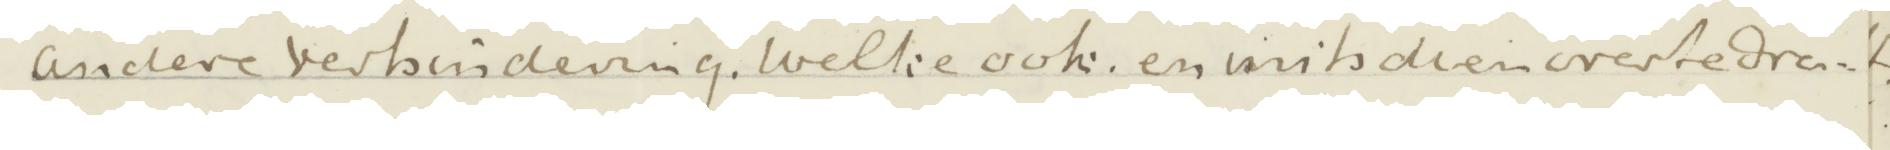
andere verhindering welke ook en mits dien over te dra„
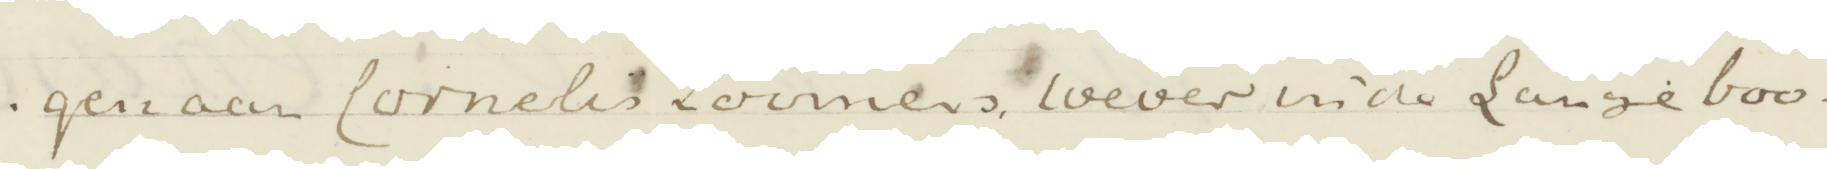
.gen aan Cornelis Zoomers wever in de Lange boo„
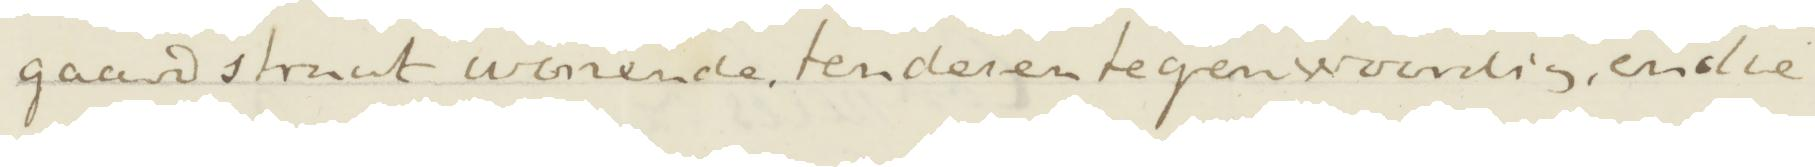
gaardstraat wonende, ten dezen tegenwoordig, en die
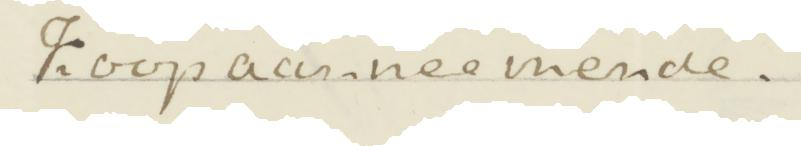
koop aanneemende
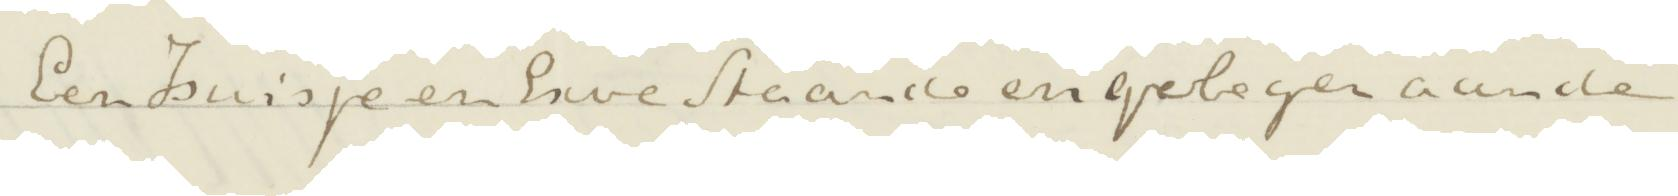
Een huisje en erve staande en gelegen aan de
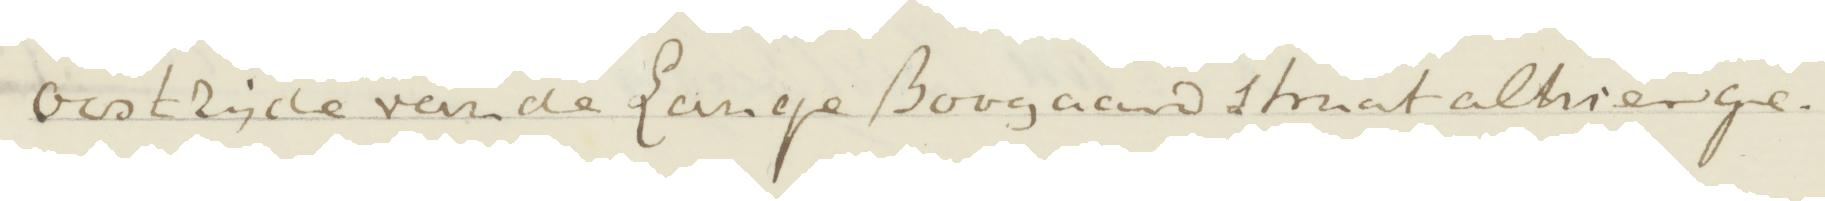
oostzijde van de Lange Boogaard straat alhier ge„
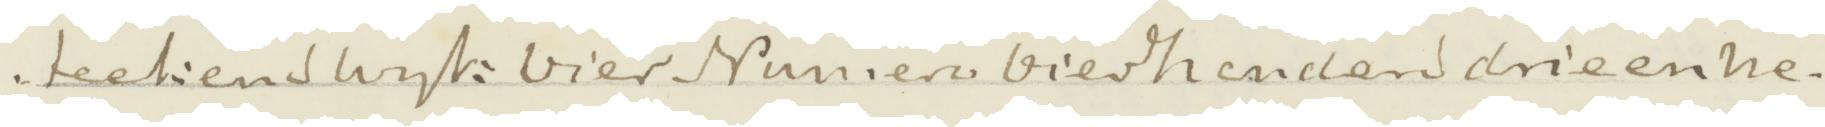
„teekend wijk Vier Numero Vierhonderd drie en ne„
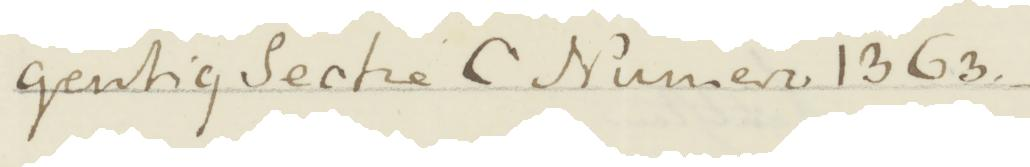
gentig sectie C Numero 1363.
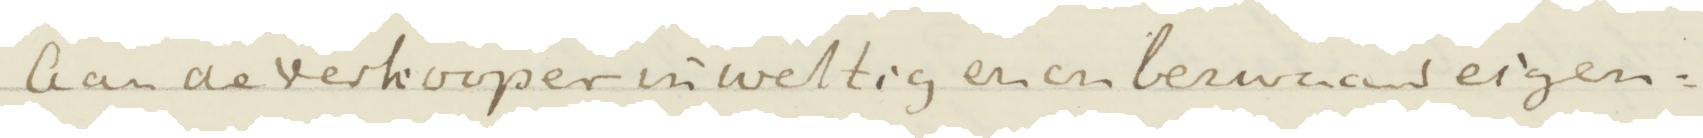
Aan de verkooper in wettig en onbezwaard eigen=
